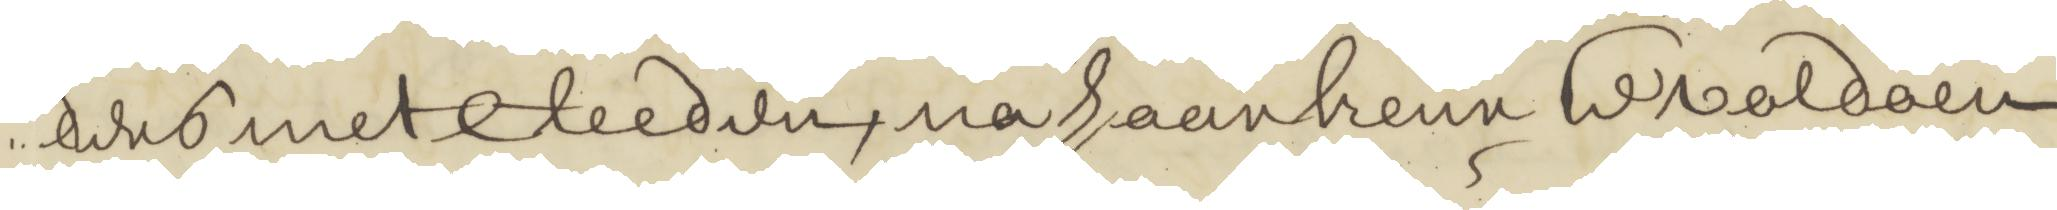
„ders met Cleeden, na haar keur te voldoen
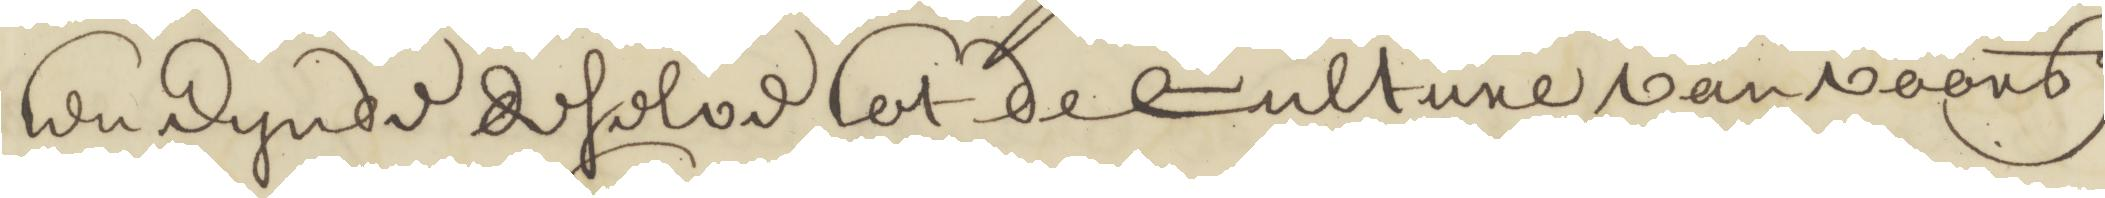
ten Eynde deselve tot de Culture van voors
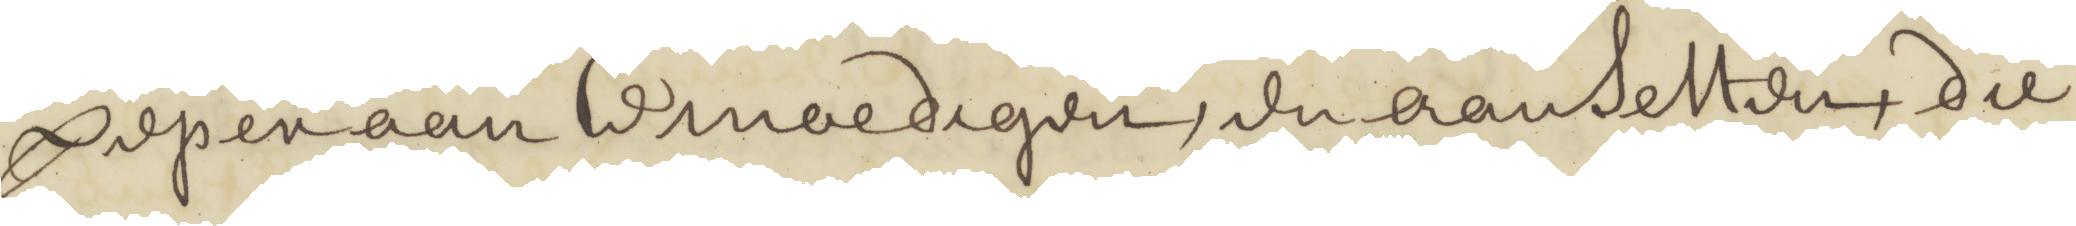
Peper aan te moedigen, en aansetten, die
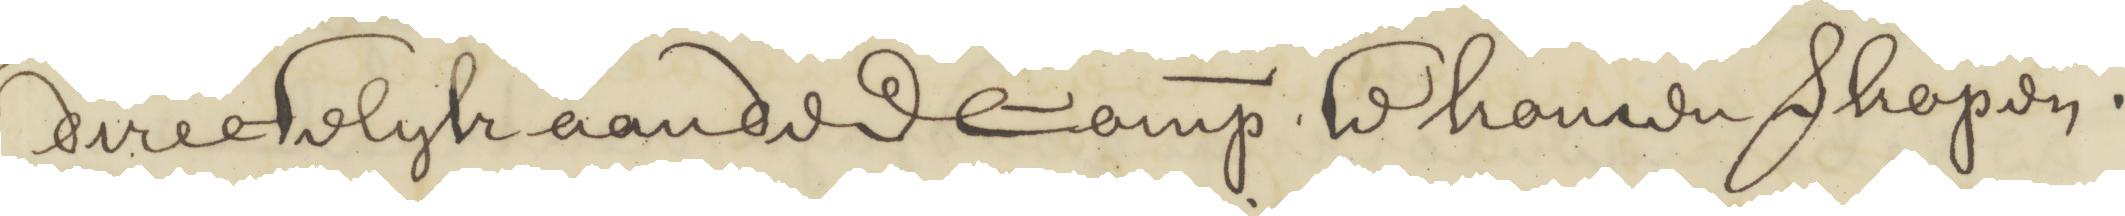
directelyk aan de EComp: te komen verkopen.
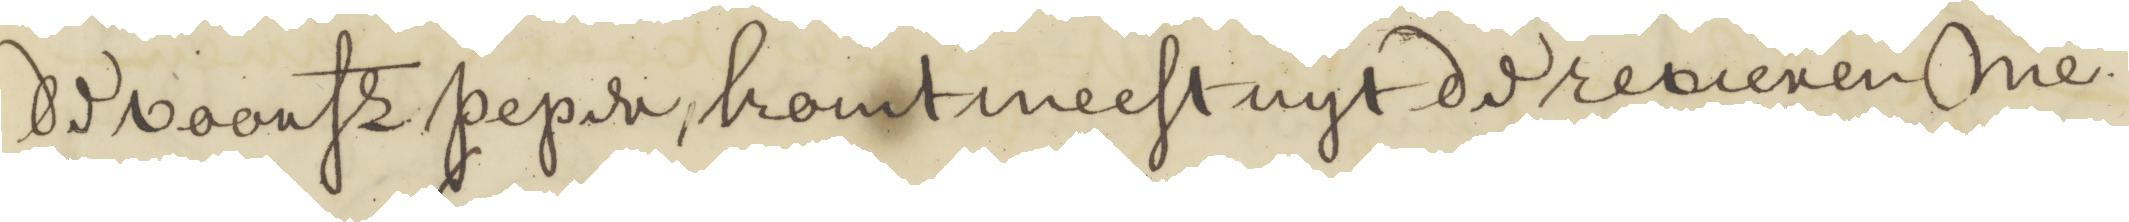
de voorsz peper, komt meest uijt de revieren me.
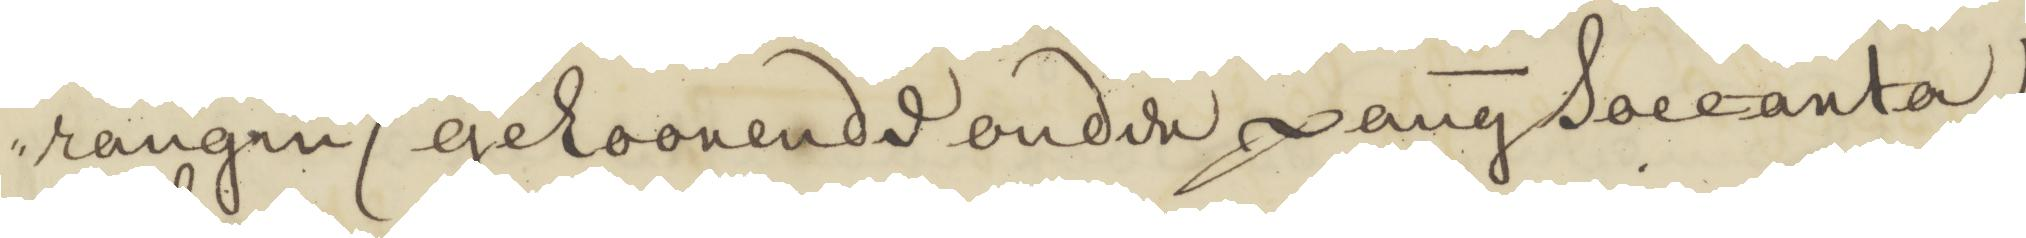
„rangin ( gehoorende onder pang Soecarta )
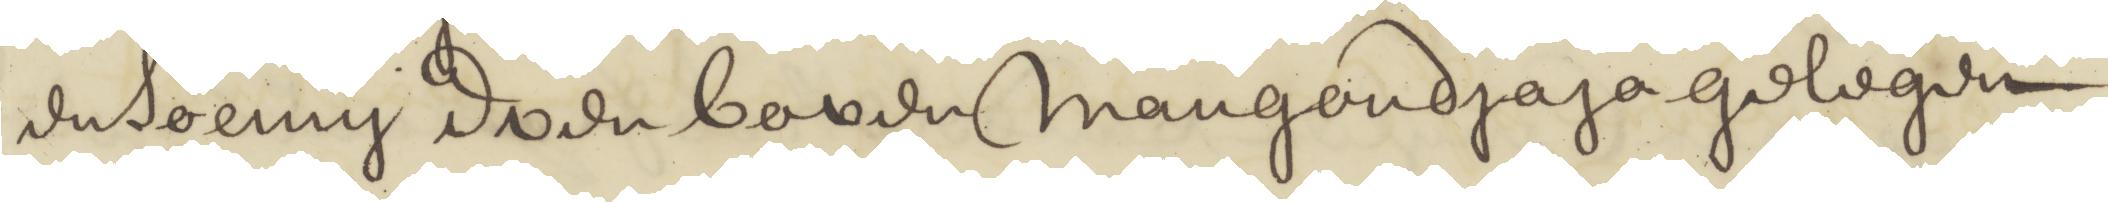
en Soemij Even boven mangondjaja gelegen
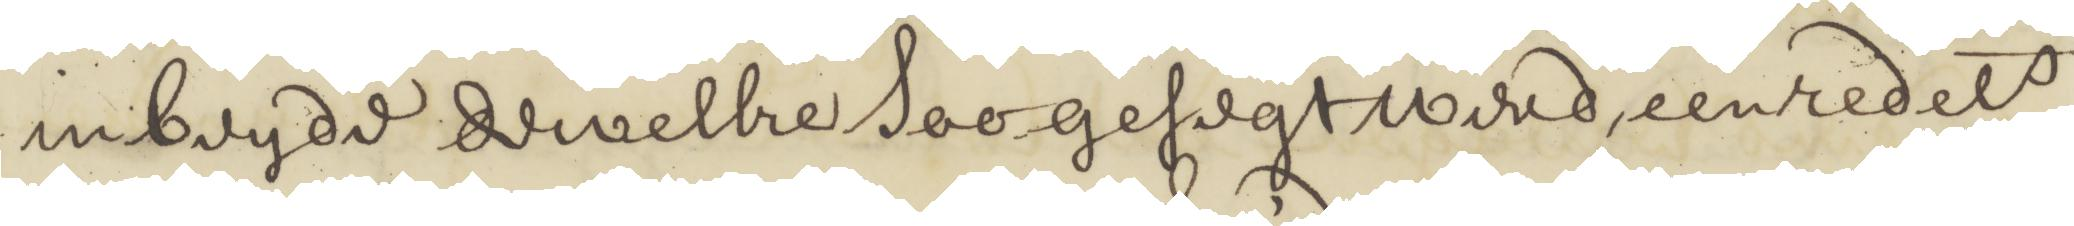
in beyde dewelke Soo gesegt werd, een redelijke
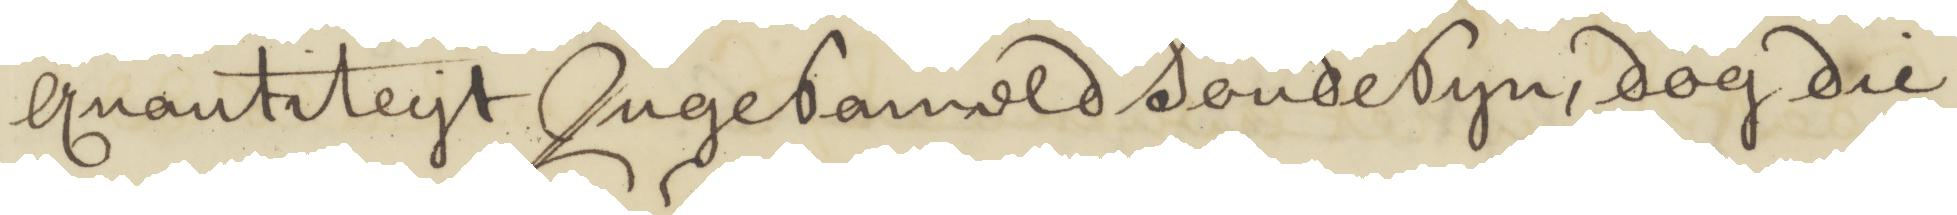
quantiteijt Jngesameld soude syn, dog die
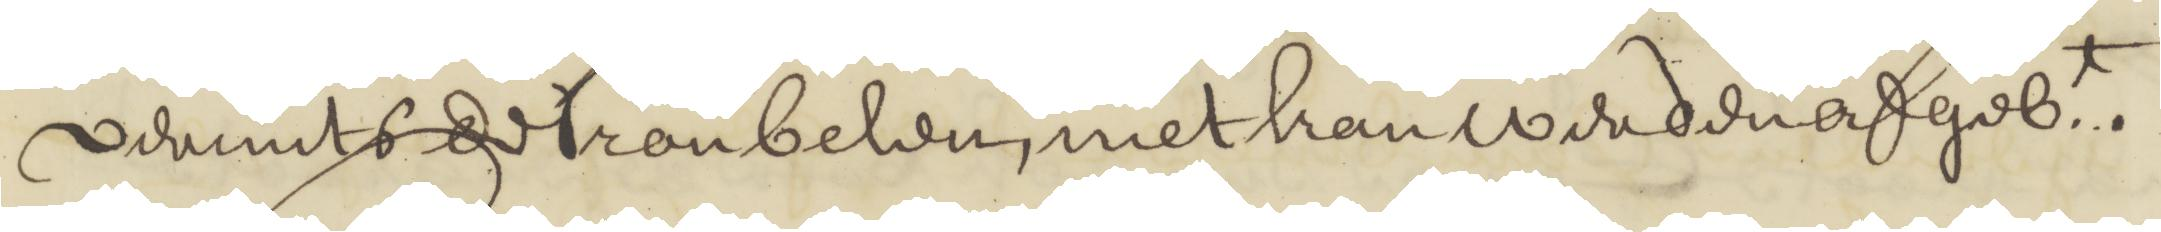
vermits de troubelen, niet kan werden afgeb„t.
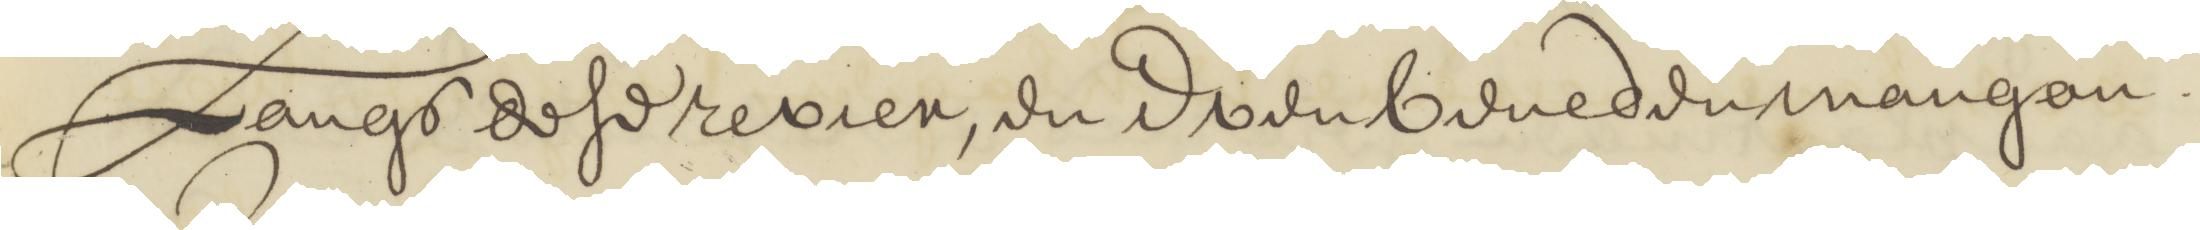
Langs dese revier, en Even beneden mangan„
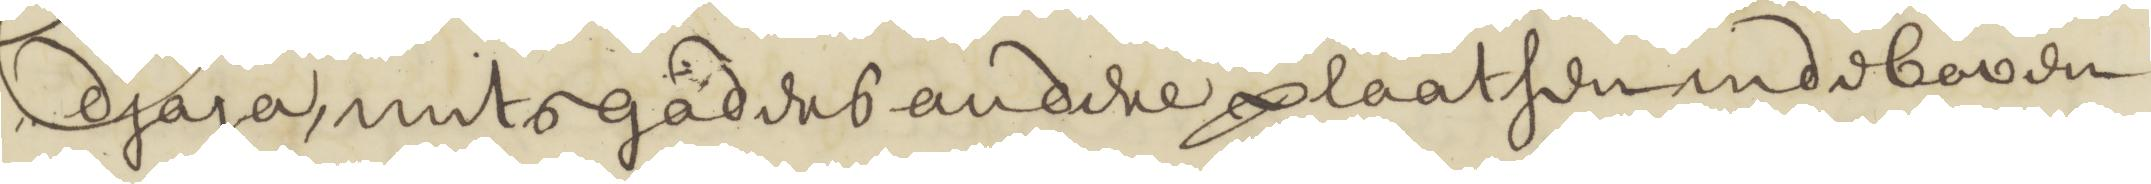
„djaja, mitsgaders andere plaatsen in de boven
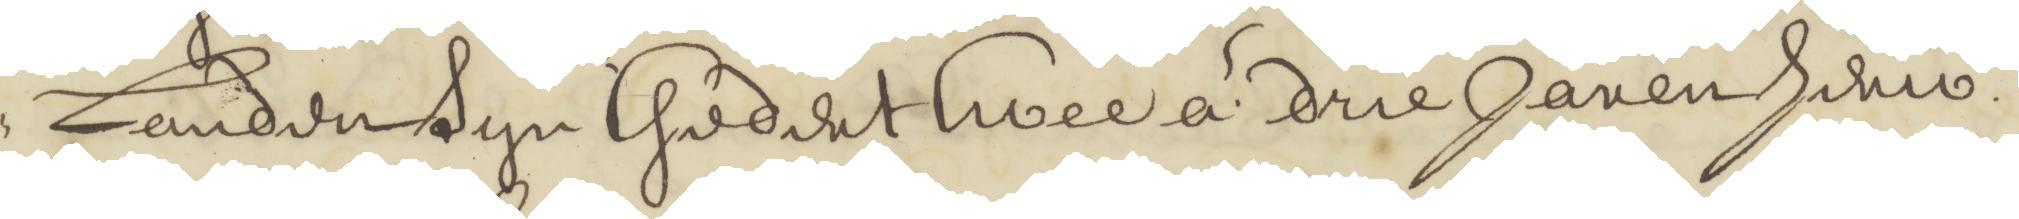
„Landen Sijn t sedert twee â drie Jaren herw.ts
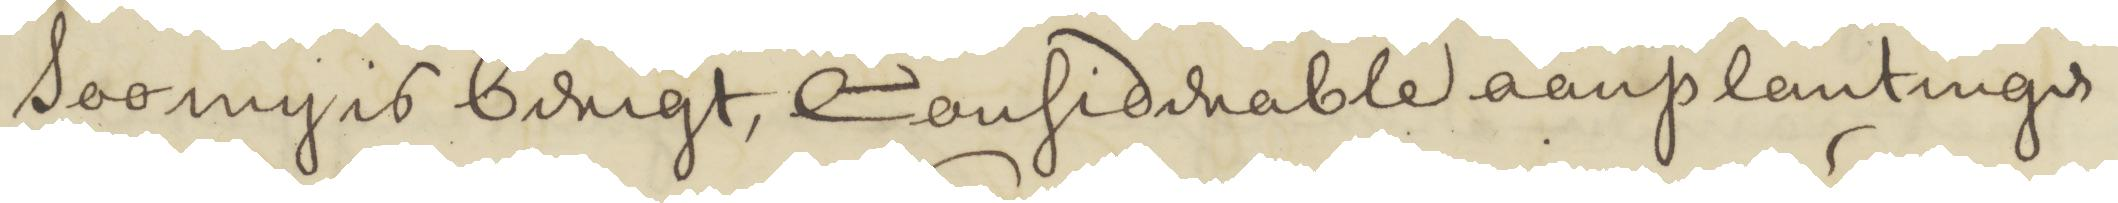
Soo mij is berigt, Considerable aanplantingen
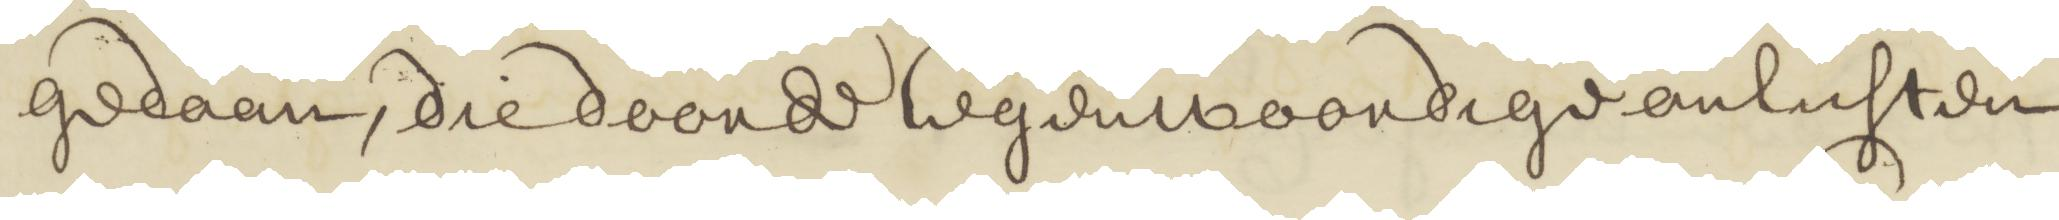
gedaan, die door de tegenwoordige onlusten
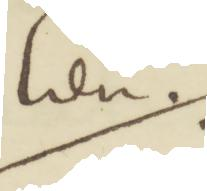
ten./.
